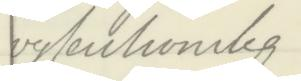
vyf entwintig
